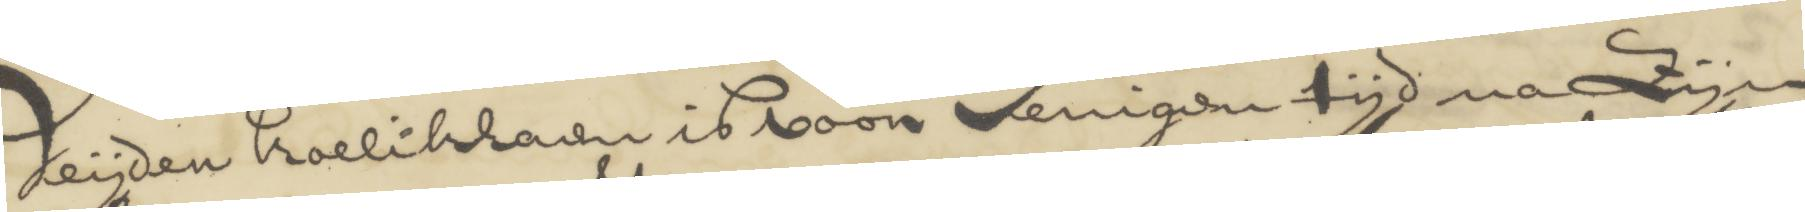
Heijden koelikhaen is voor eenigen tijd na zijn
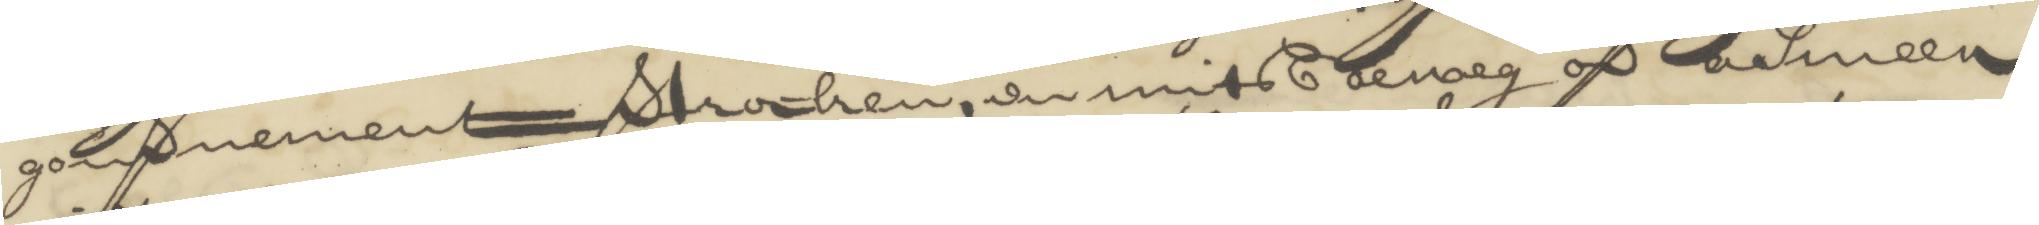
gouvernement vertrocken, en mits de weg over asmeer
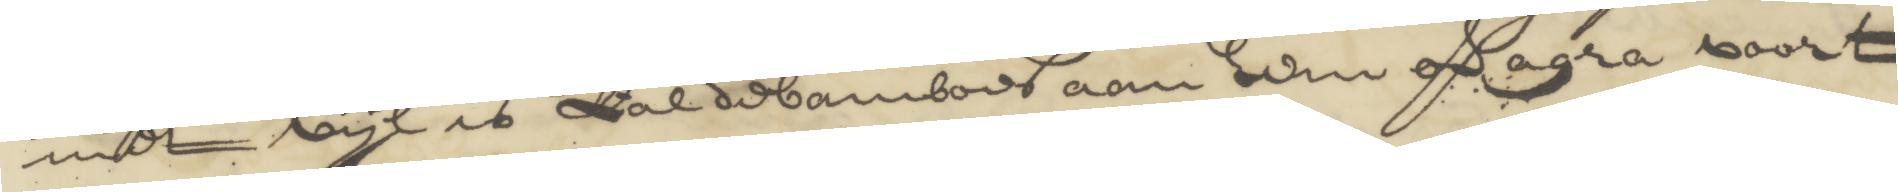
niet vijl is zal de bamboes aan hem over agra voor't
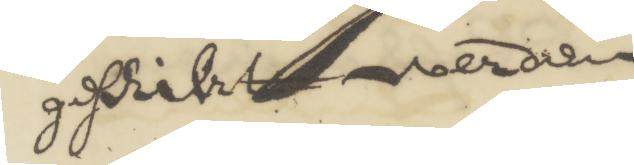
geschikt werden.
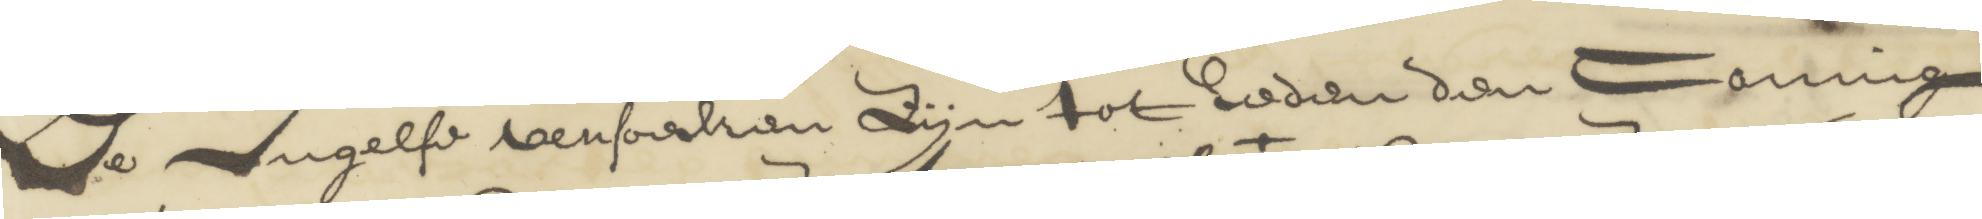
De Engelse versoecken zijn tot heden den Coning
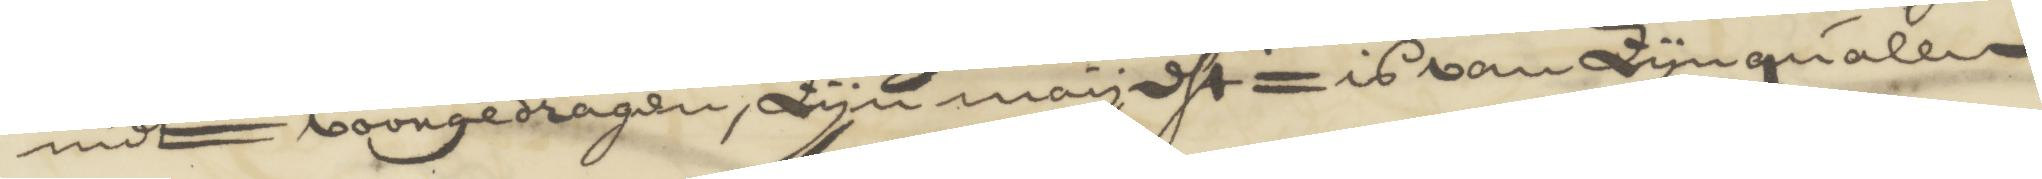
niet voorgedragen, zijn maijest=t is van zijn qualen,
